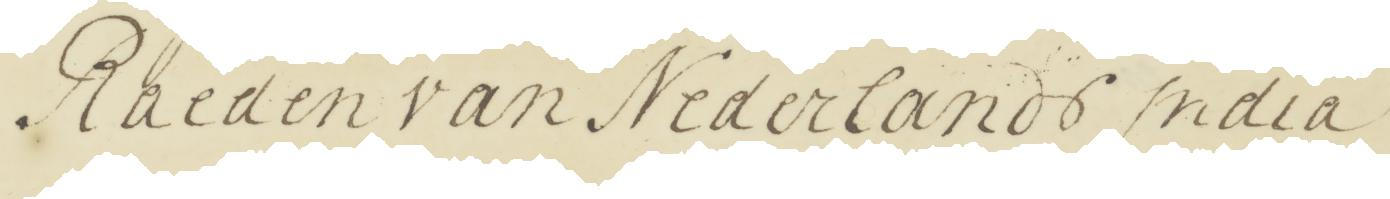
Raeden van Nederlands Jndia
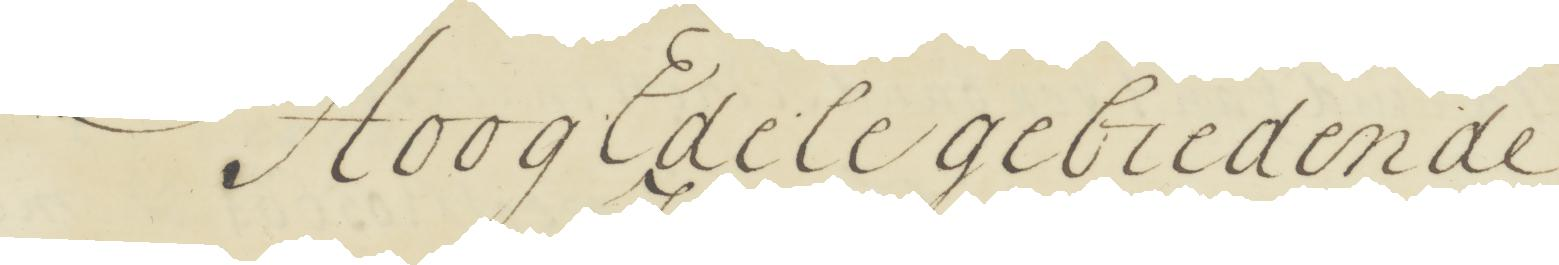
Hoog Edele gebiedende
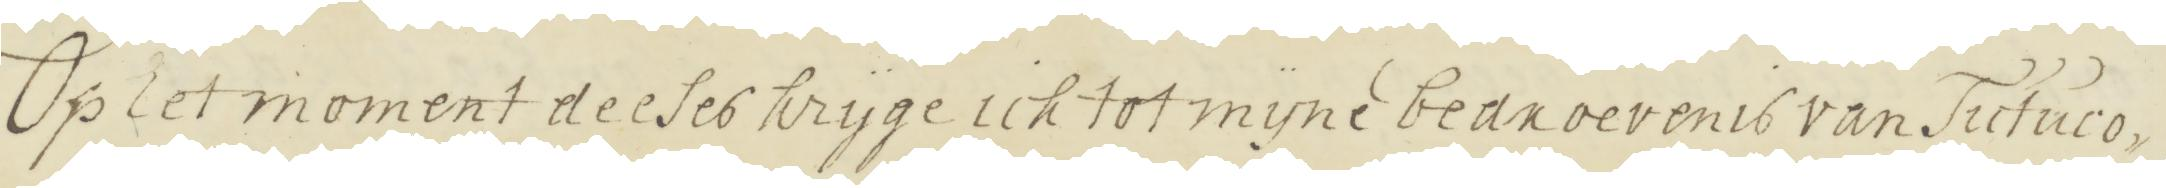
Op het moment deeses krijge ick tot mijne bedroevenis van Tutuco„
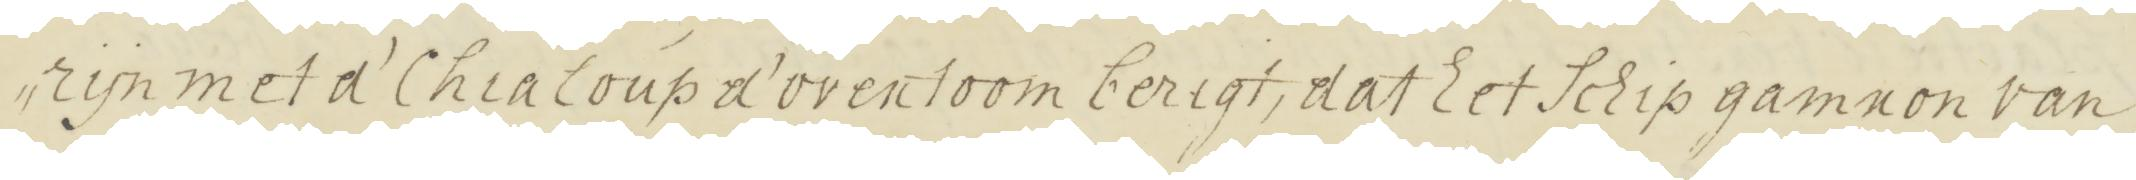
„rijn met d’ Chialoup d' overtoom berigt, dat het schip gamron van
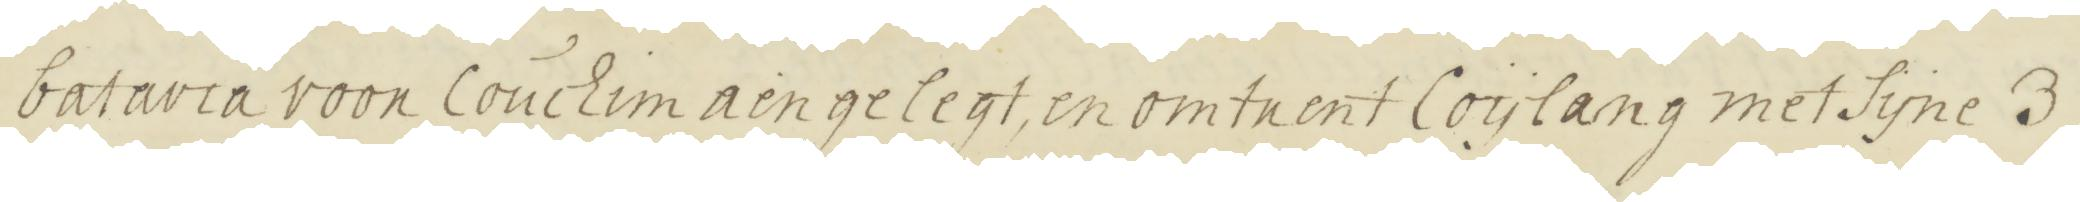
batavia voor Couchim aengelegt, en omtrent Coijlang met sijne 3
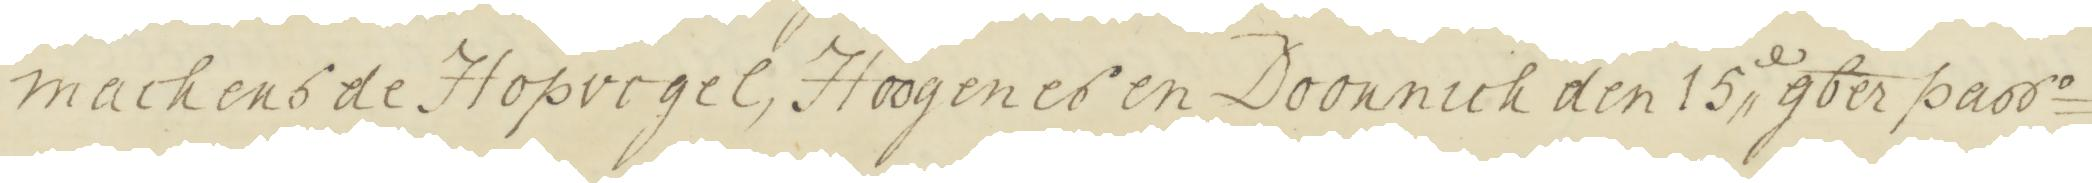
mackers de Hopvogel, Hoogenes en Doornick den 15„e gber pass=o
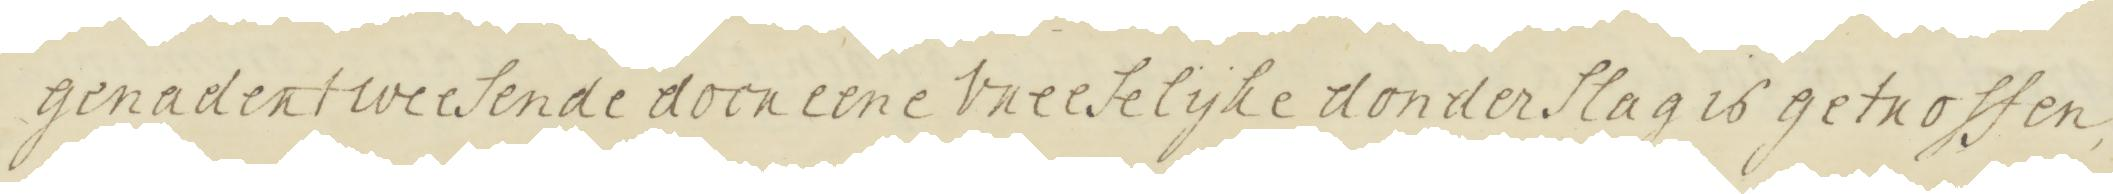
genadert weesende door eene vreeselijke donderslag is getroffen,
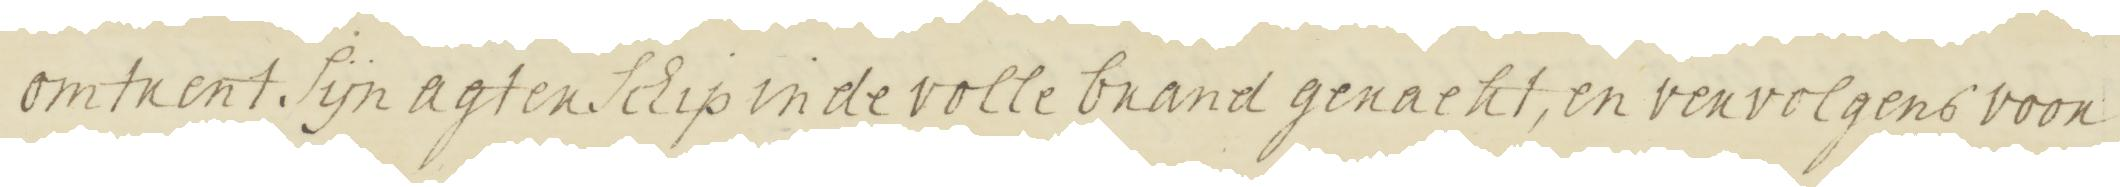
omtrent sijn agterschip in de volle brand geraekt, en vervolgens voor
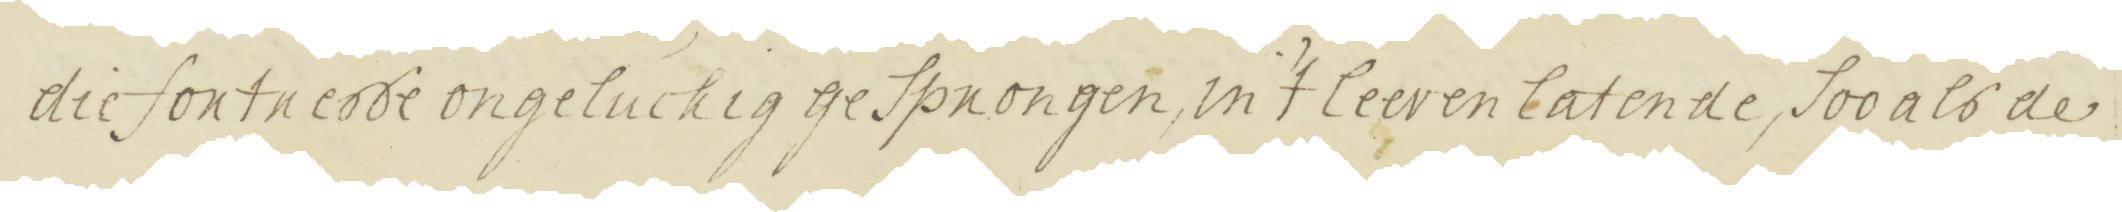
die fortresse ongeluckig gesprongen, in ’t leeven latende, soo als de
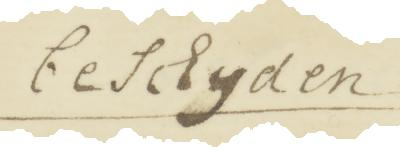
beschyden
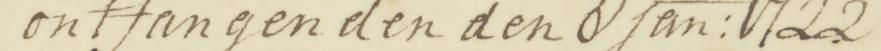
ontfangen den den 8 Jan: 1722
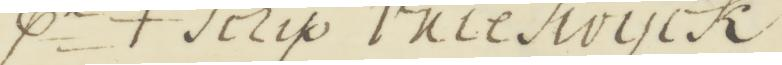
P=r ’t schip Vrieswijck
